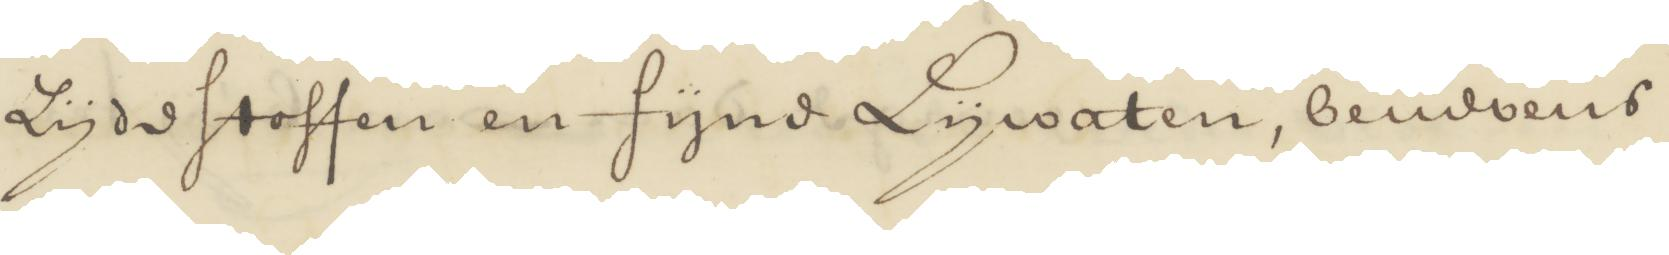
zijde stoffen en fijne Lijwaten, benevens
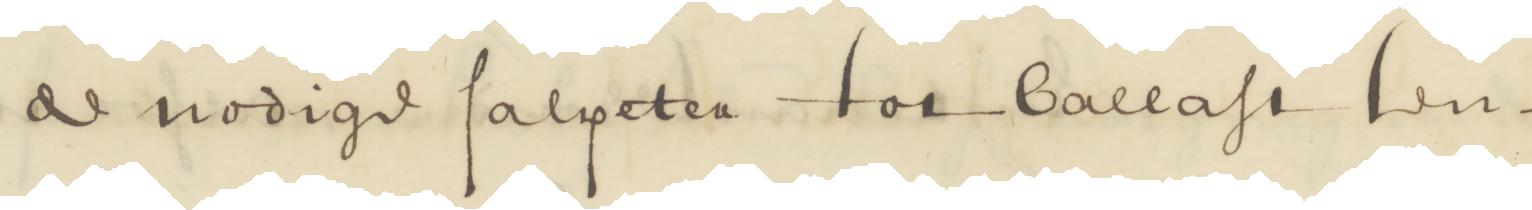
de nodige salpeter tot ballast ten
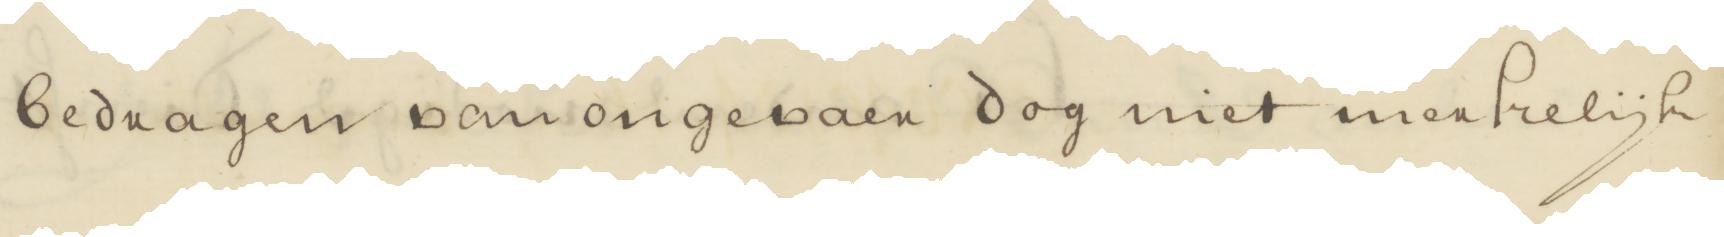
bedragen van ongevaer dog niet merkelijk
